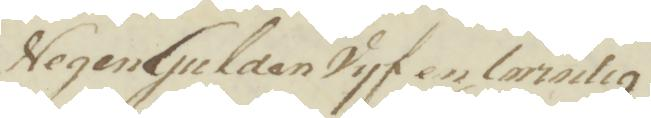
Negen Gulden Vyf en twintig
